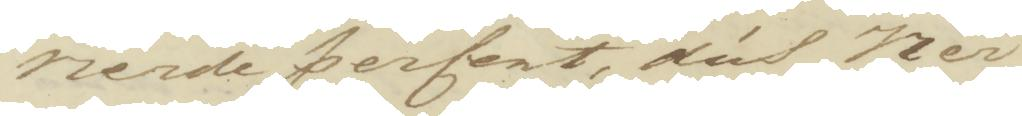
vierde percent, dus Vier
